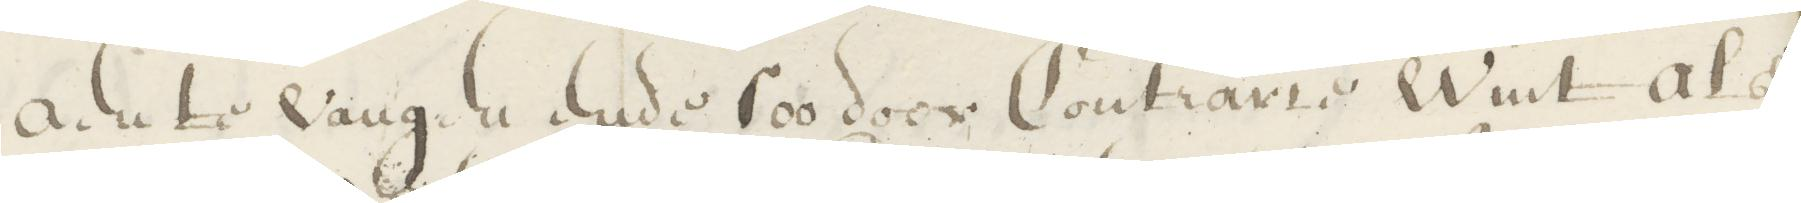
aen te vangen ende soo door Contrarie Wint als
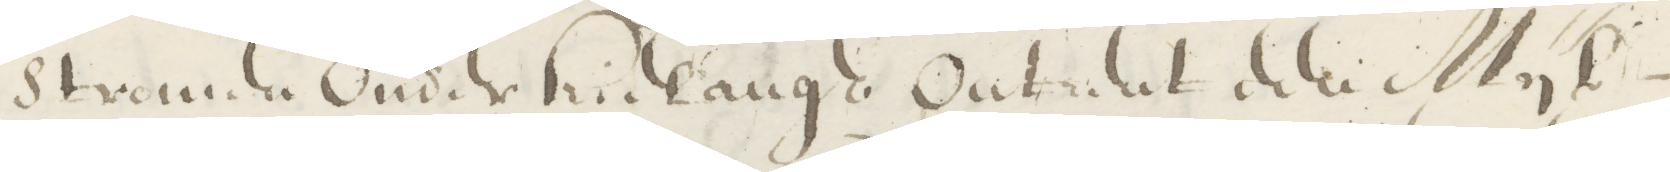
stromen Onder kielangh Ontrent den Mijl
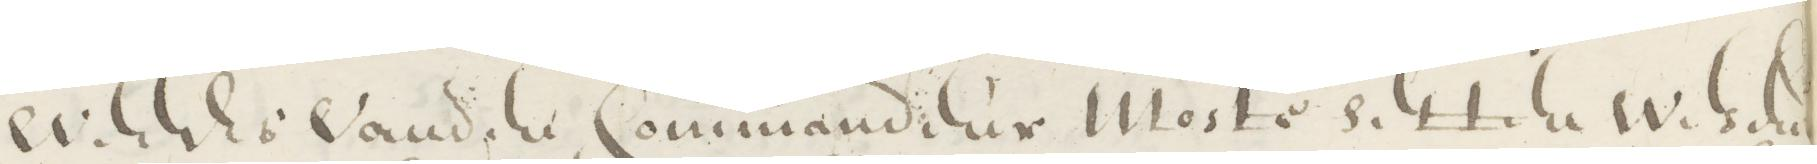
weechs vanden Commandeur moste setten wesen
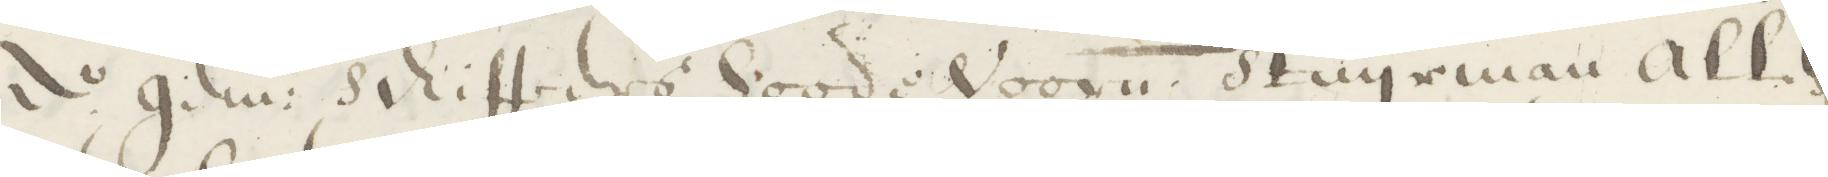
E. gem: schippers soo de voorn. stuijrman allen
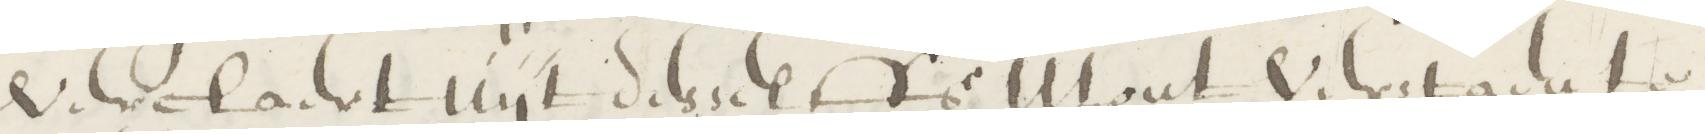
verclaert uijt desselffs mont verstaen te
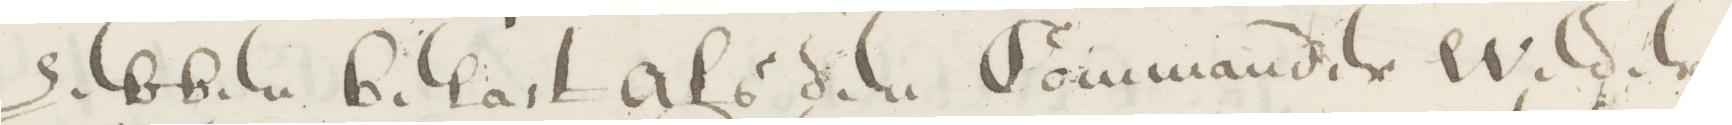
hebben belast als den Commander weder
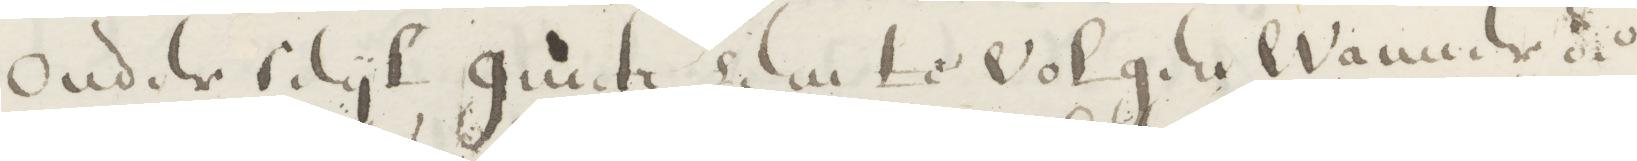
onder seijl ginck hem te volgen wanner de
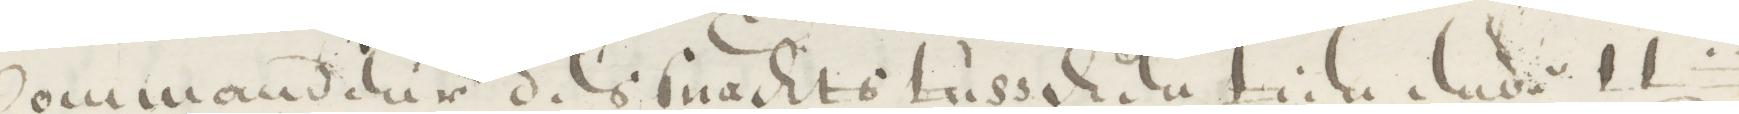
Commandeur des snachts tusschen tien ende 11=e
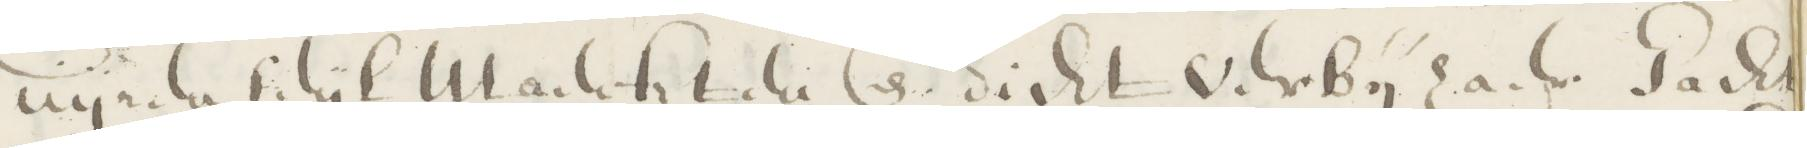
uijren seijl maeckten ende dicht verbij haer Iacht
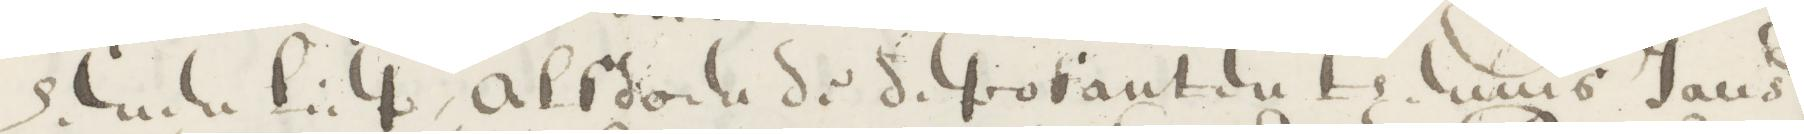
henen liep, alsdoen de deposant en theunis Ians
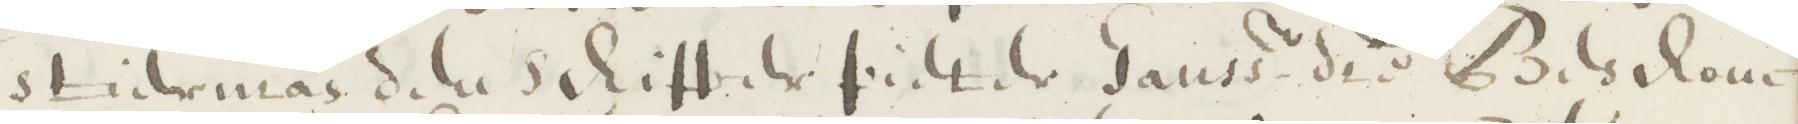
stierman den schipper pieter Ianss-n die Beschonc
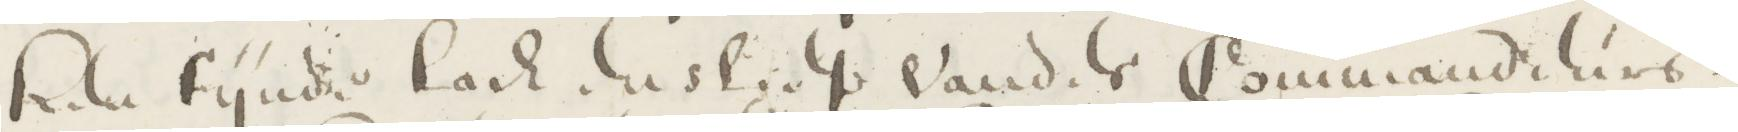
ken sijnde lach en sliep vander Commandeurs
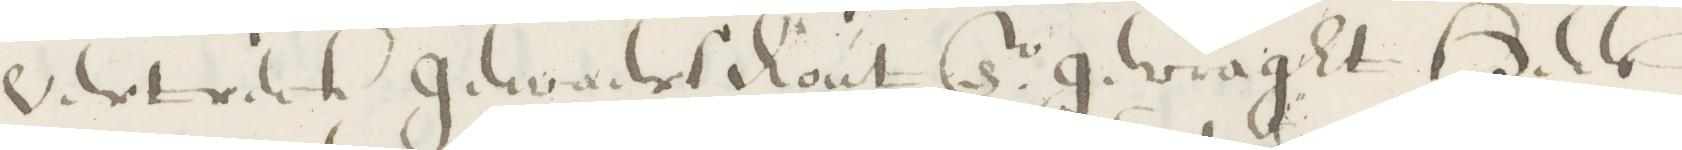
vertreck gewaerschout ende gevraght heeft
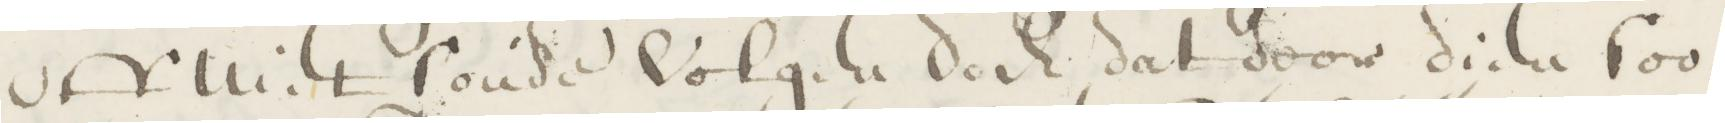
off niet soude volgen doch dat door dien soo
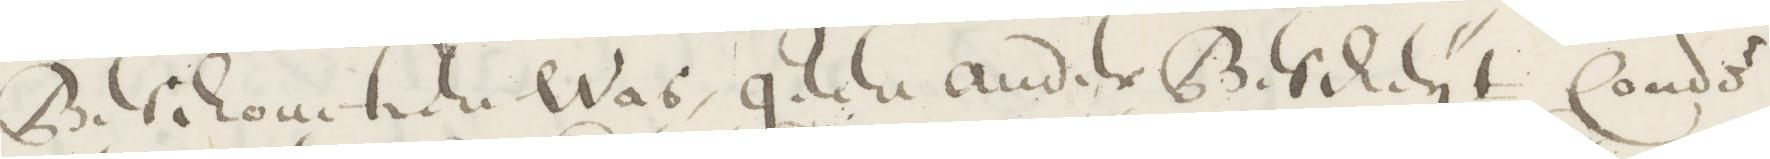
Beschoncken was, geen ander Bescheijt Conde
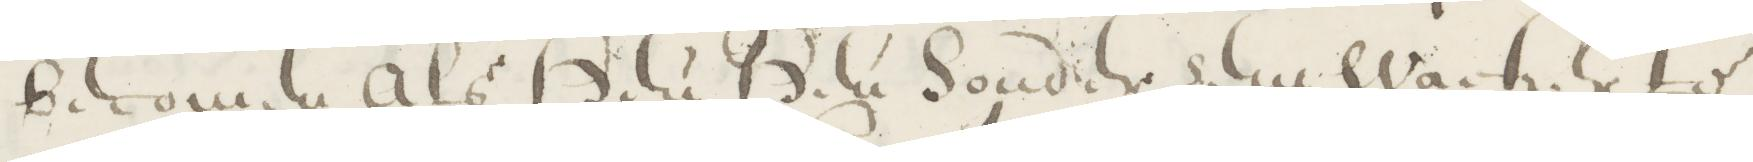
becomen als heu heu sonder hem wacker te
